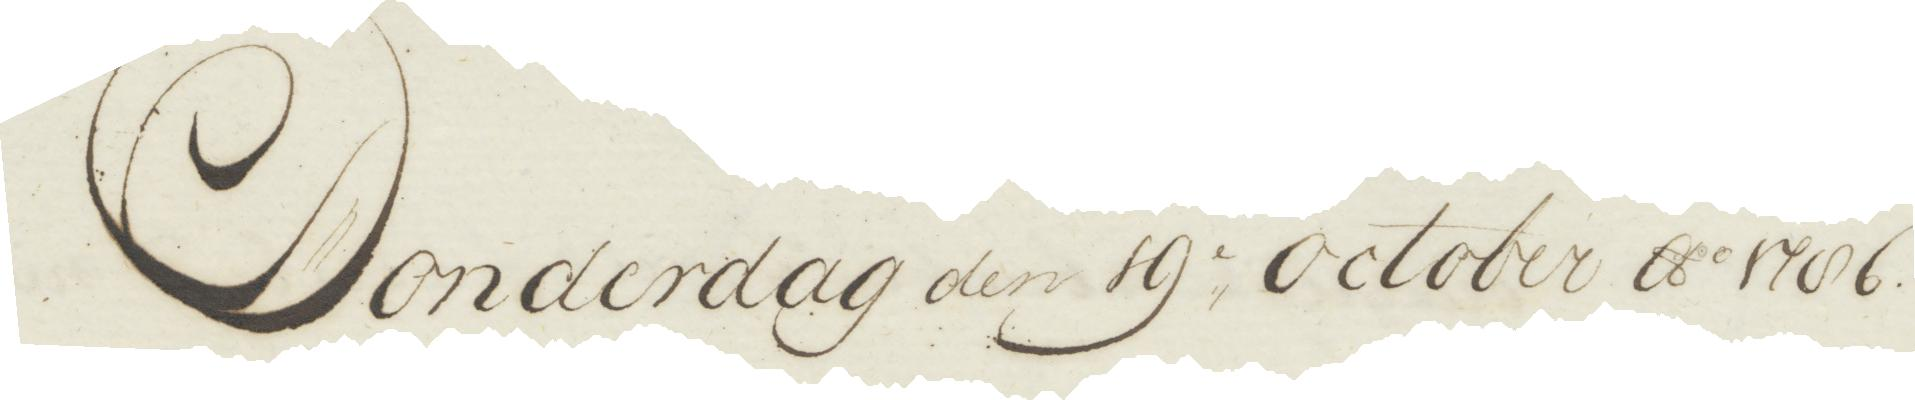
Donderdag den 19„e October Ao 1786
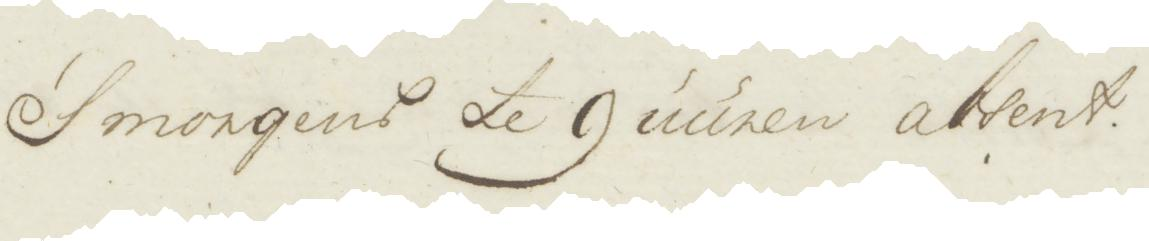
'S morgens te 9 uuren absent.
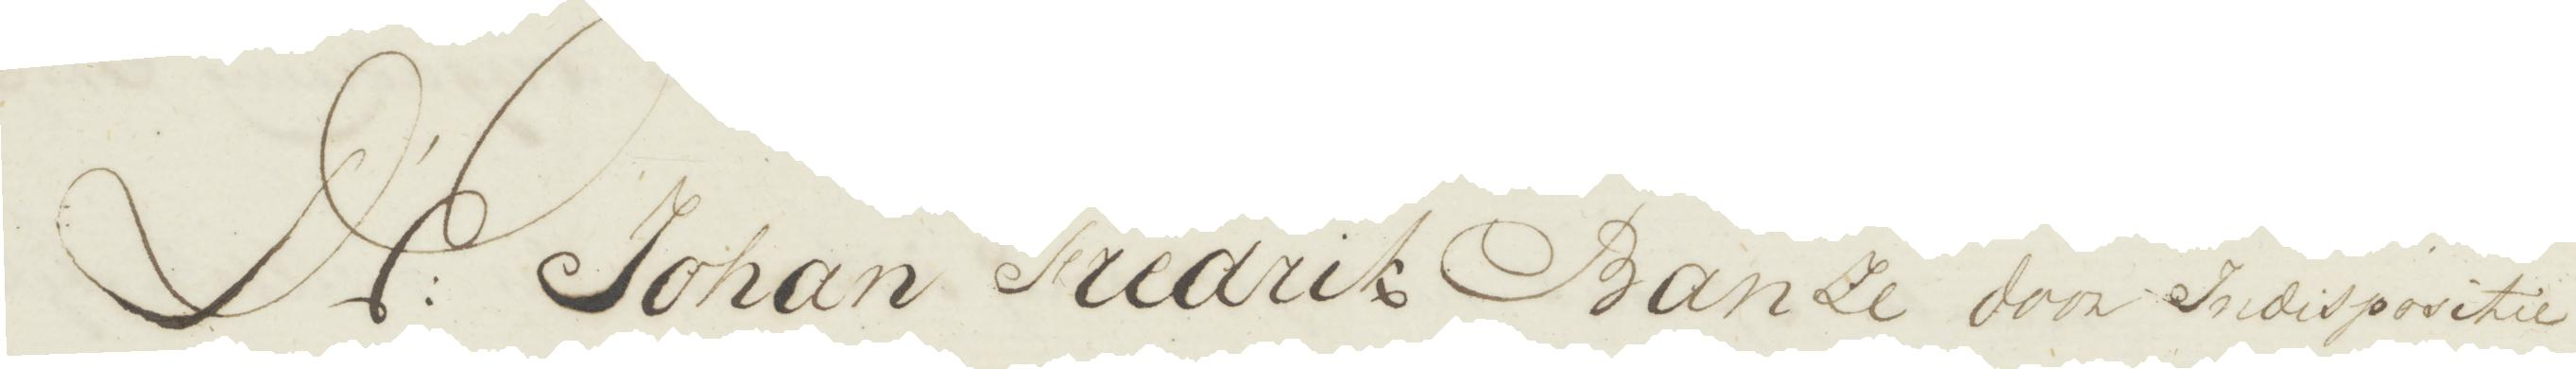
D'E: Iohan Fredrik Banze door Indispositie
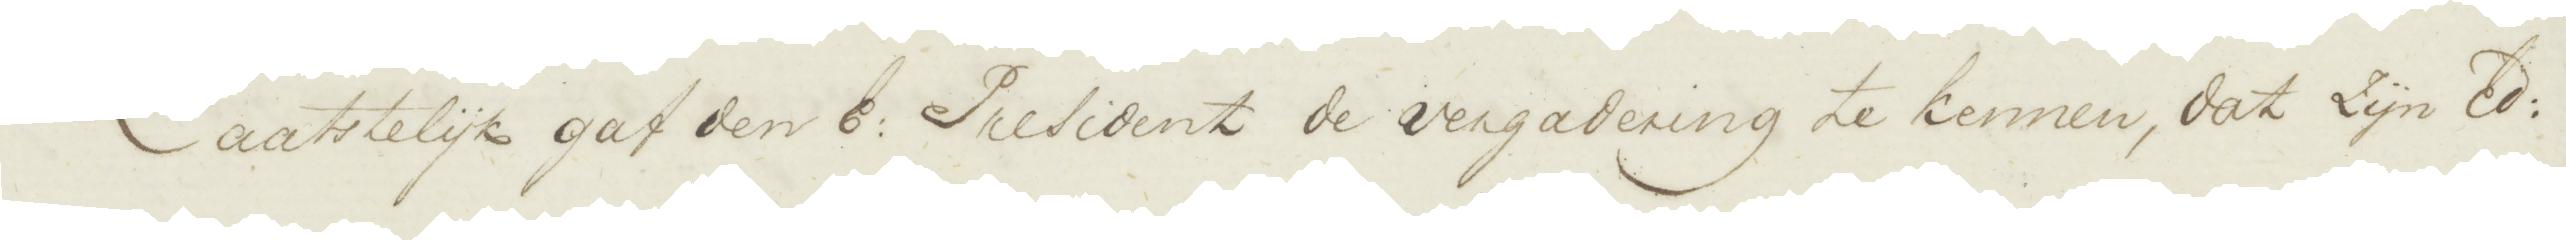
Laatstelijk gaf den E: President de vergadering te kennen, dat zijn Ed:
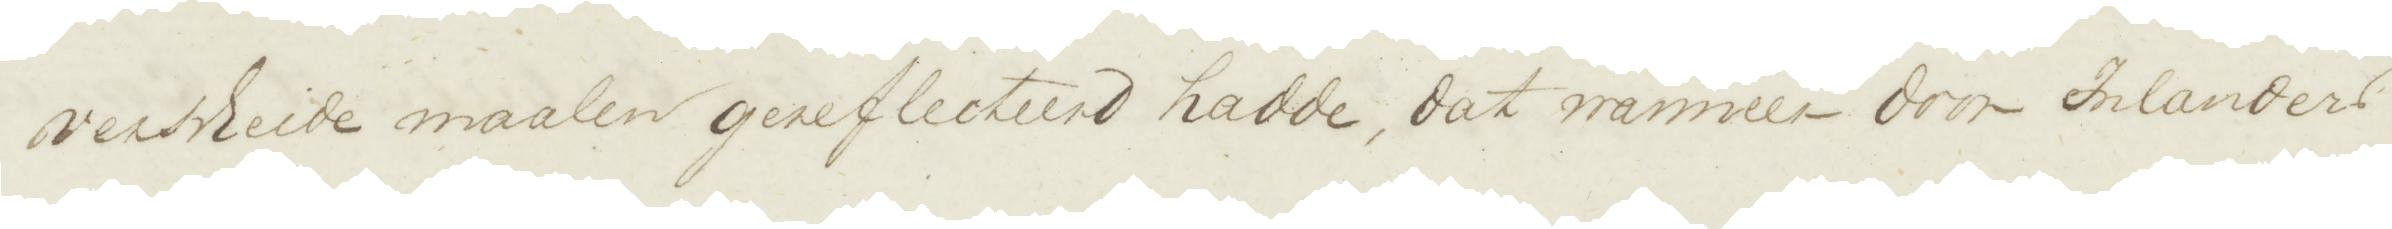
verscheide maalen gereflecteerd hadde, dat wanneer door Inlanders
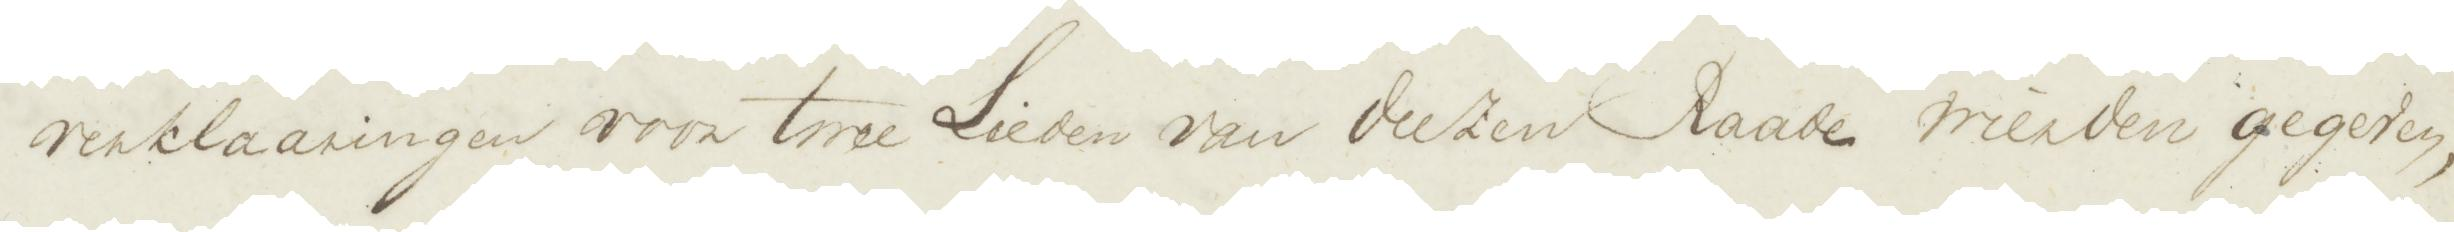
verklaaringen voor twee lieden van deezen Raade wierden gegeven,
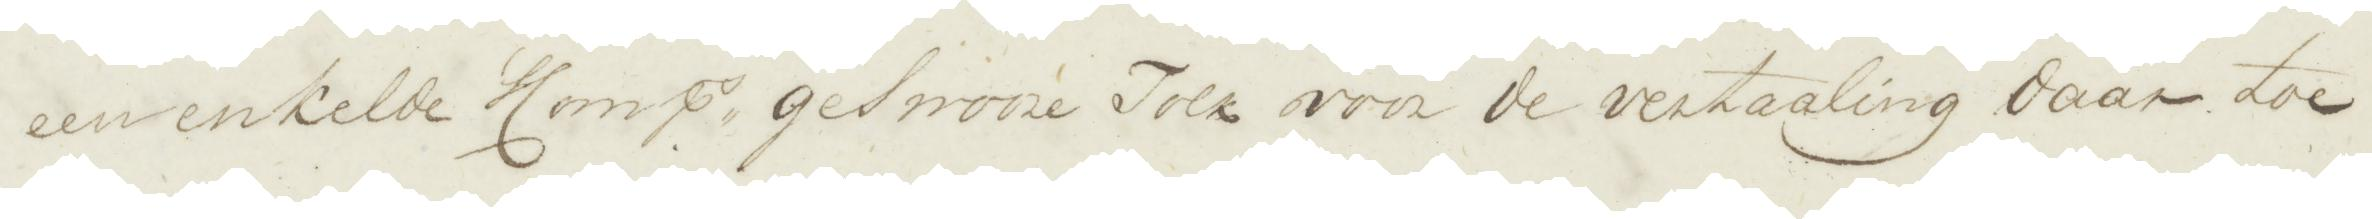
een enkelde ’sComp„s geswoore Tolk voor de vertaaling daar toe
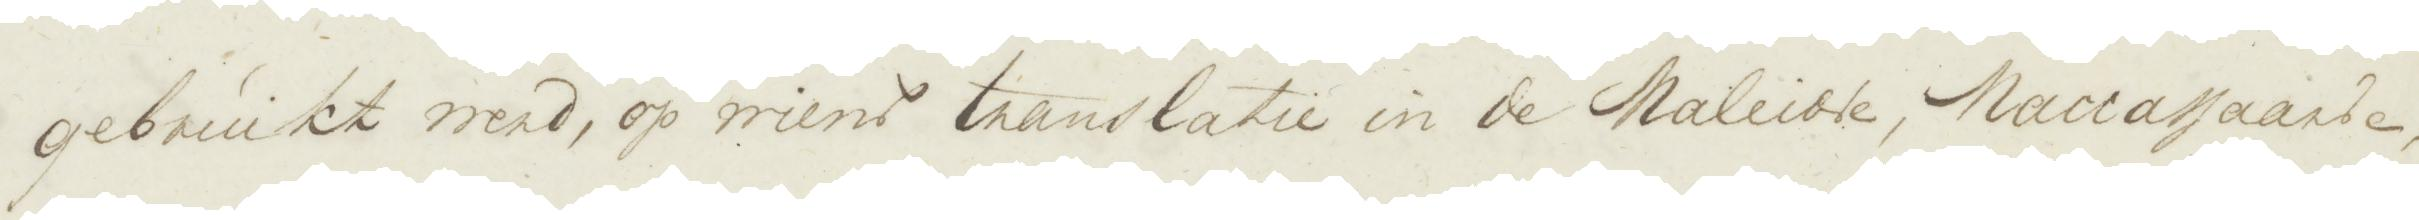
gebruikt werd, op wiens translatie in de Maleidse, Naccassaarse
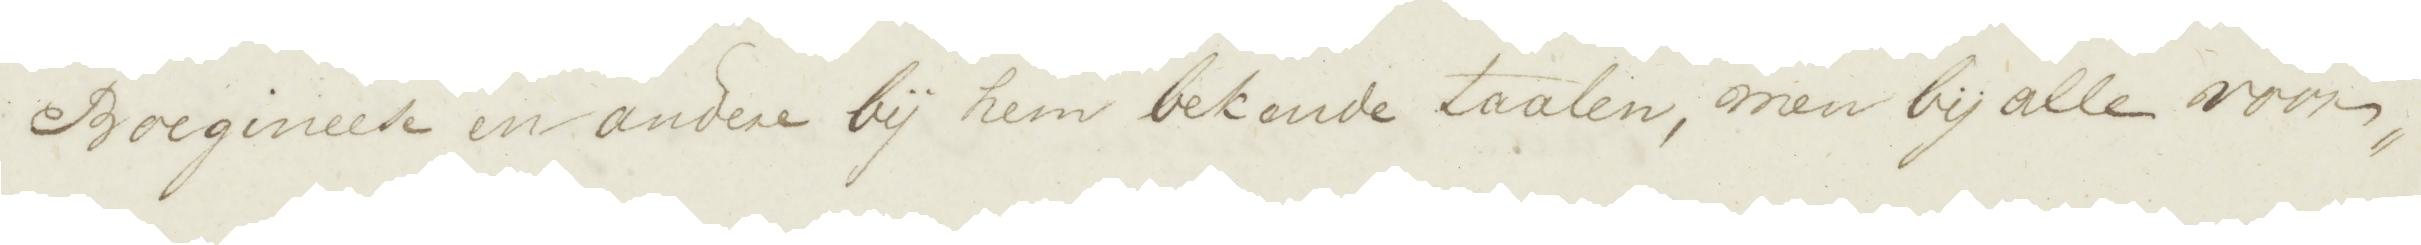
Boegineese en andere bij hem bekende taalen, men bij alle voor„
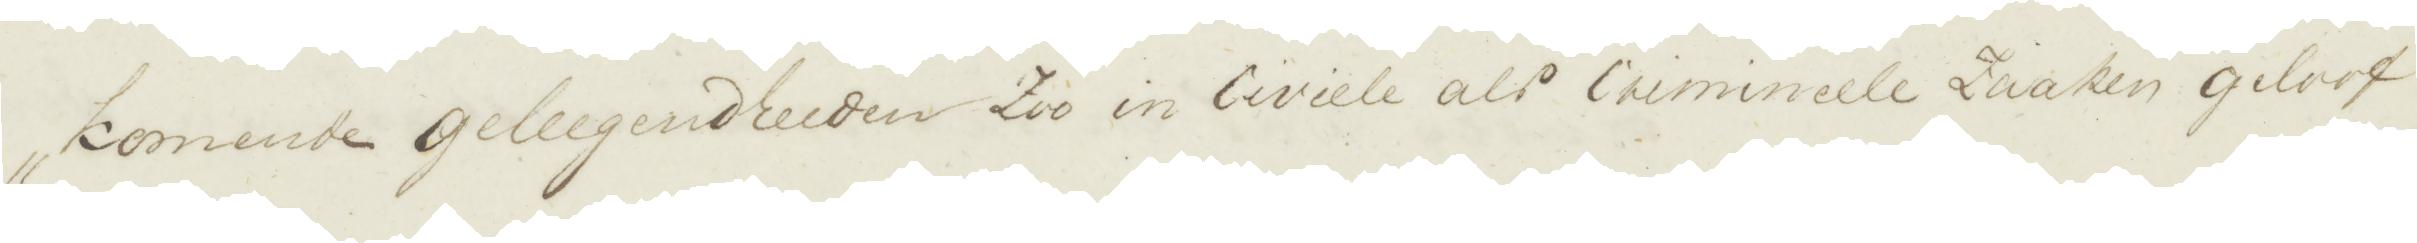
„komende geleegendheeden zoo in Civiele als Crimineele zaaken geloof
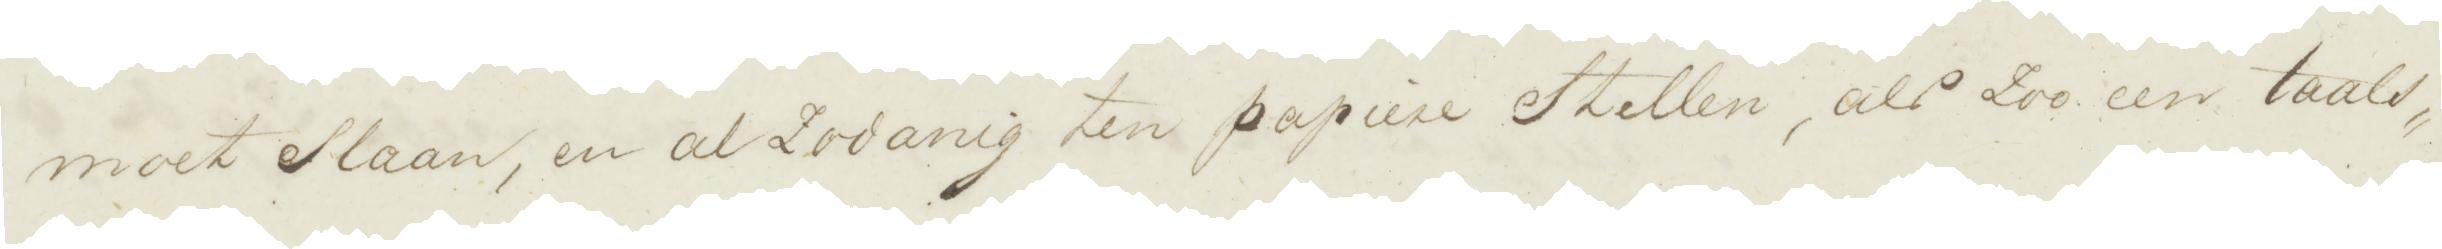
moet slaan, en al zodanig ten papiere stellen, als zoo een taals„
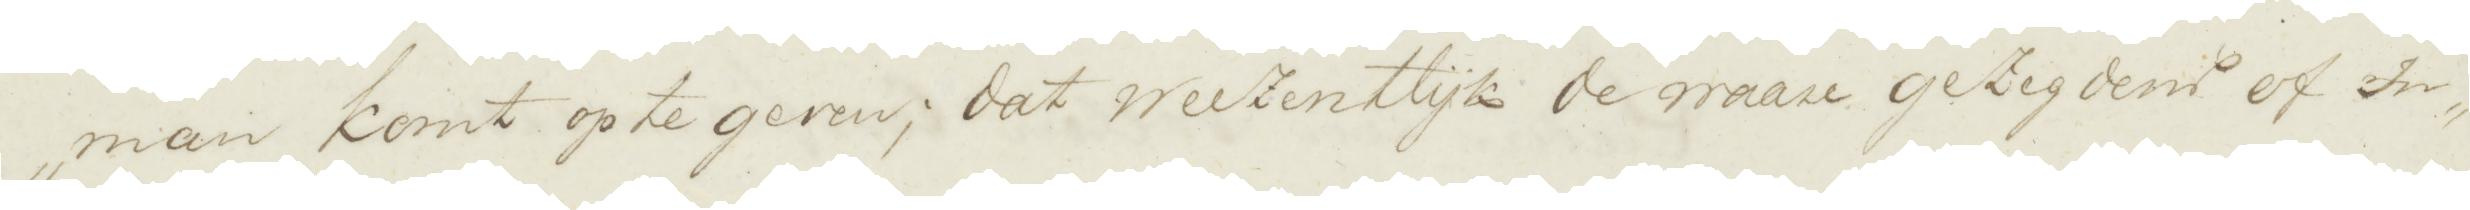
„man komt op te geven, dat weezentlijk de waare gezegden of In„
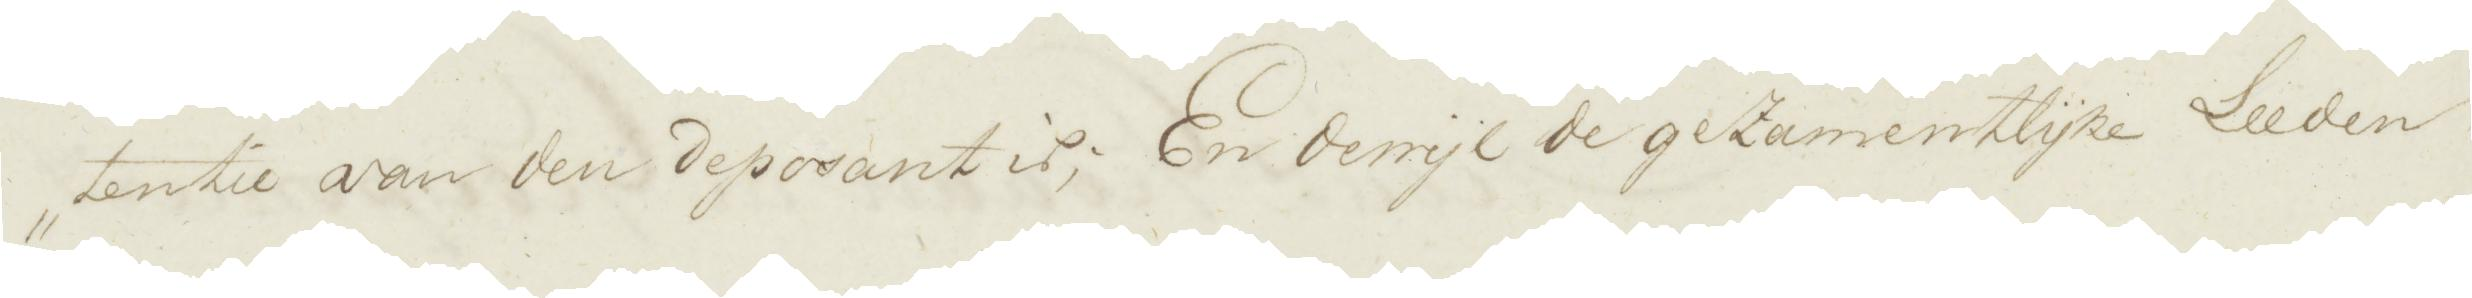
„tentie van den deposant is; En dewijl de gezamentlijke Leeden
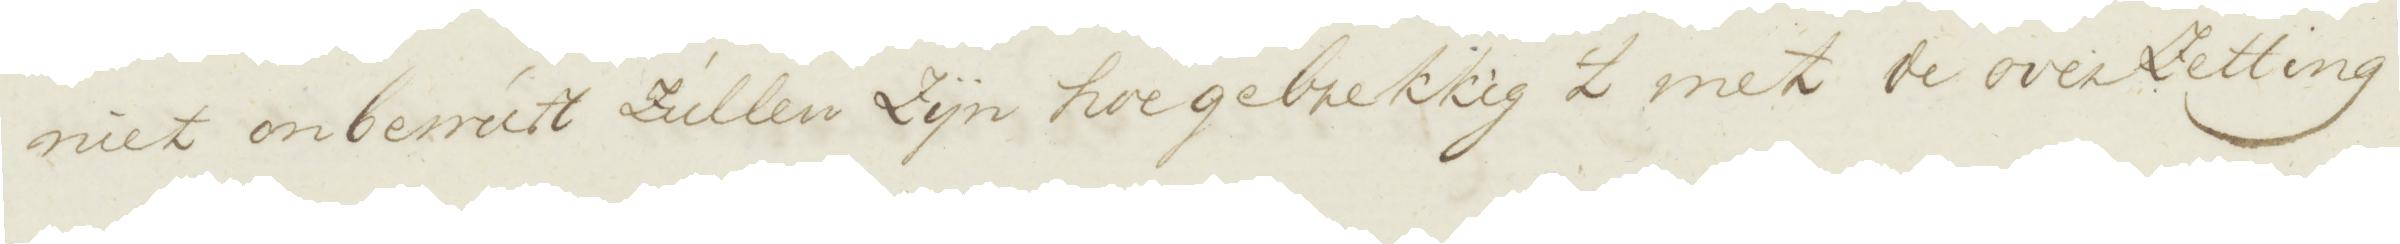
niet onbewust zullen zijn hoe gebrekkig 't met de overzetting
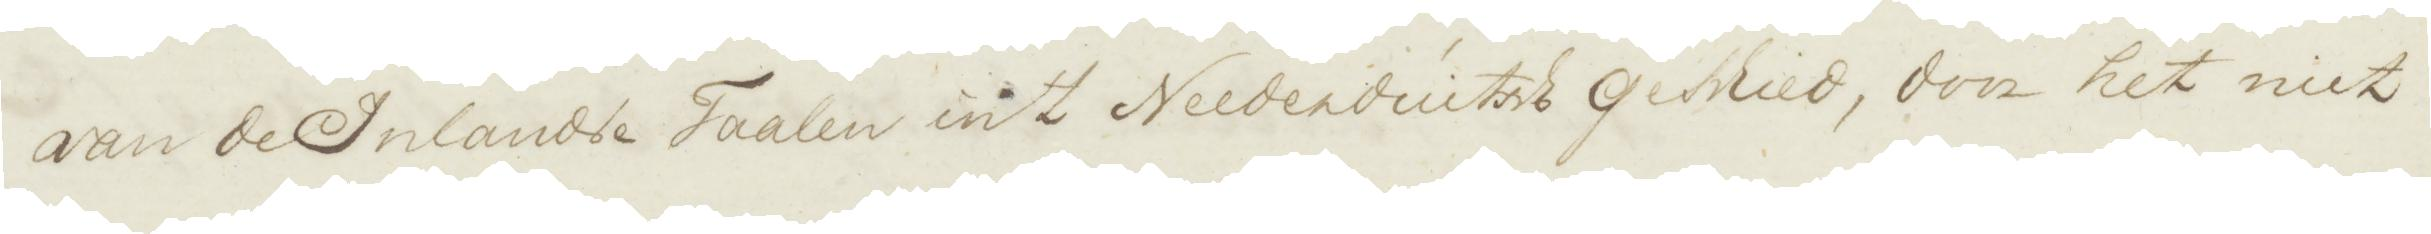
van de Inlandse Taalen in’t Neederduits geschied, door het niet
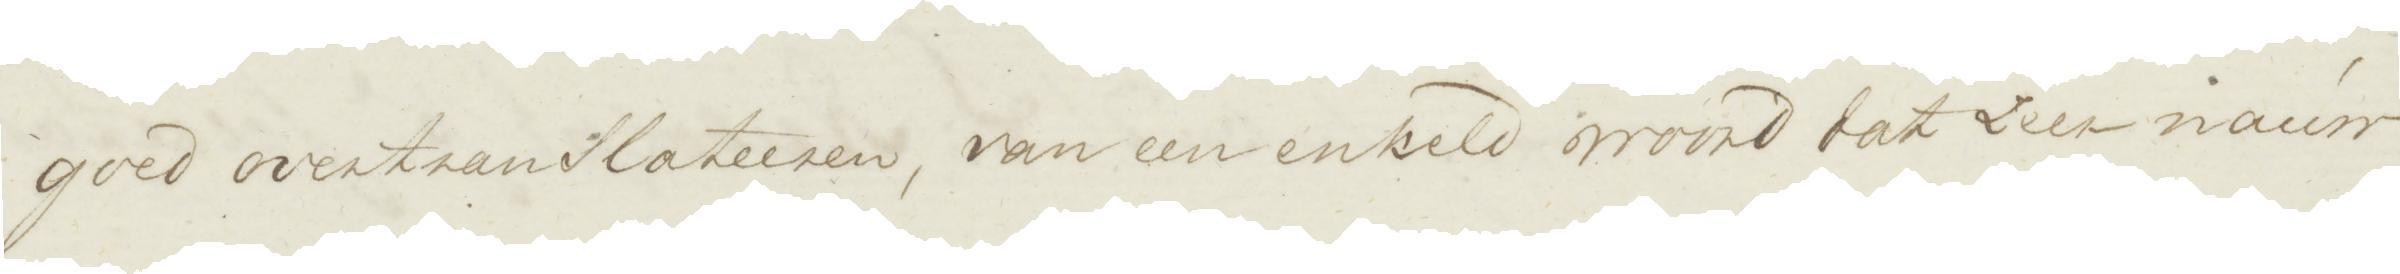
goed overtranslateeren, van een enkeld woord dat zeer nauw
